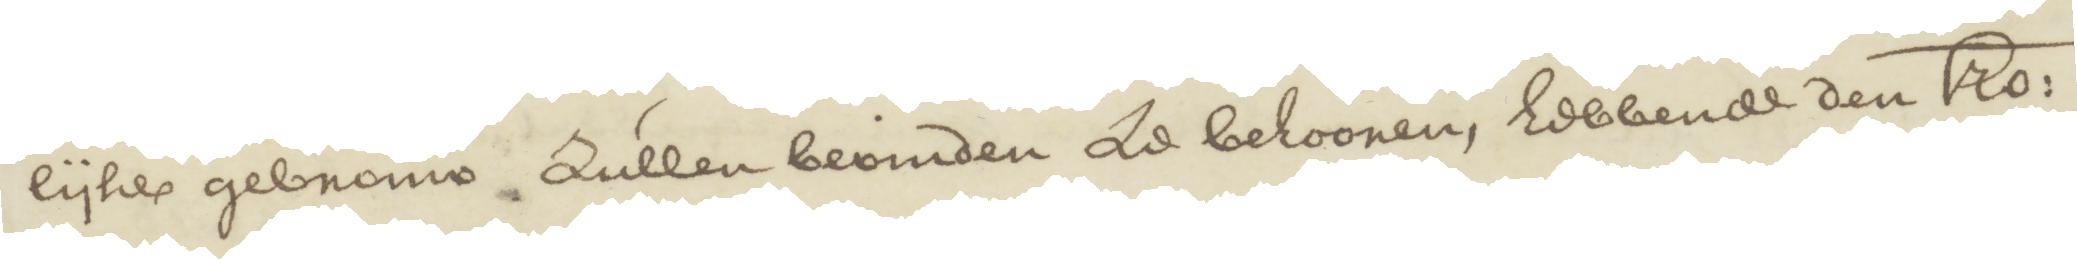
lijke gebrouw zullen bevinden te behooren, hebbende den Ko:
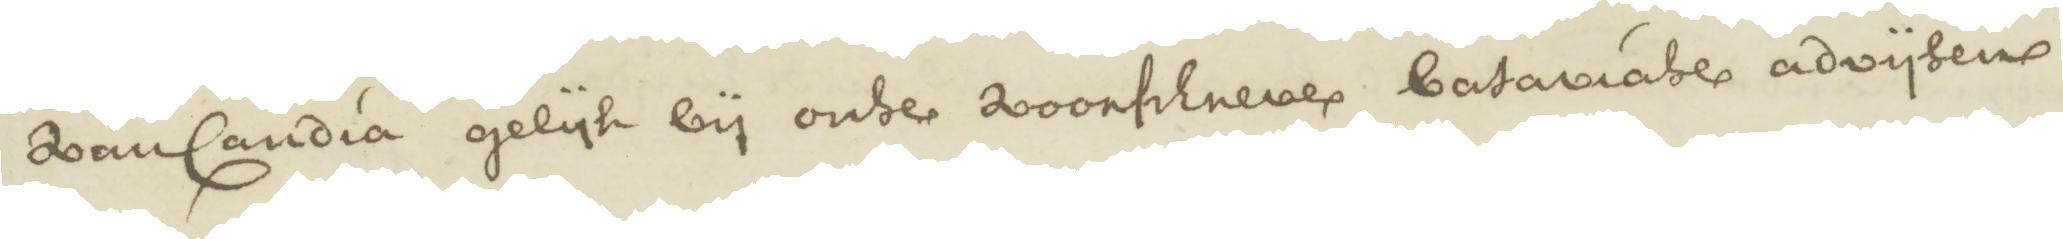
van Candia gelijk bij onse voorschreve bataviase advijsen
